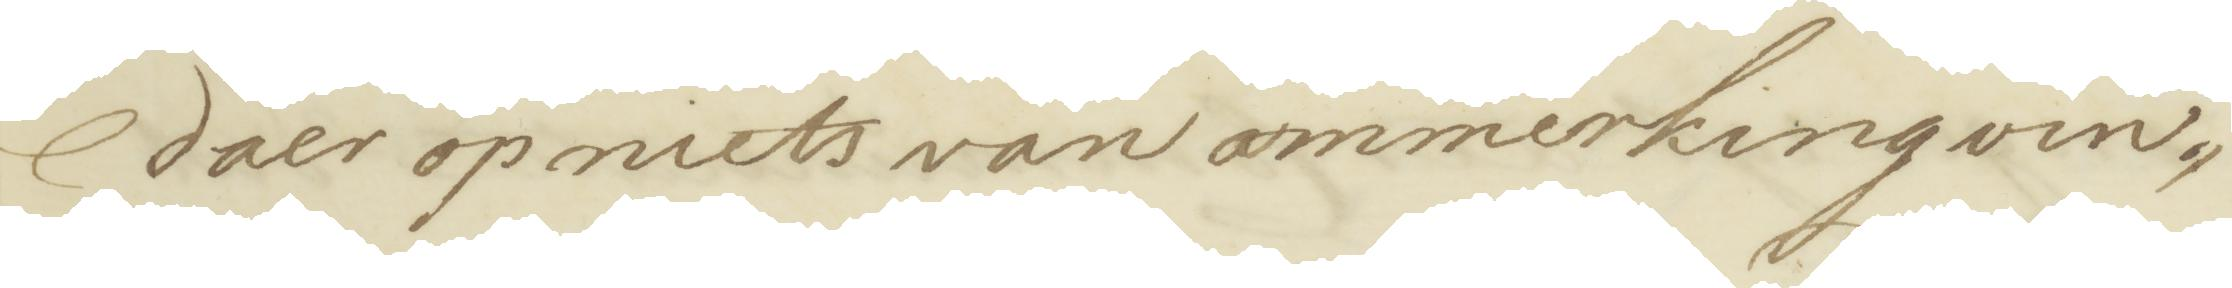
daer op niets van ommerking vin„
